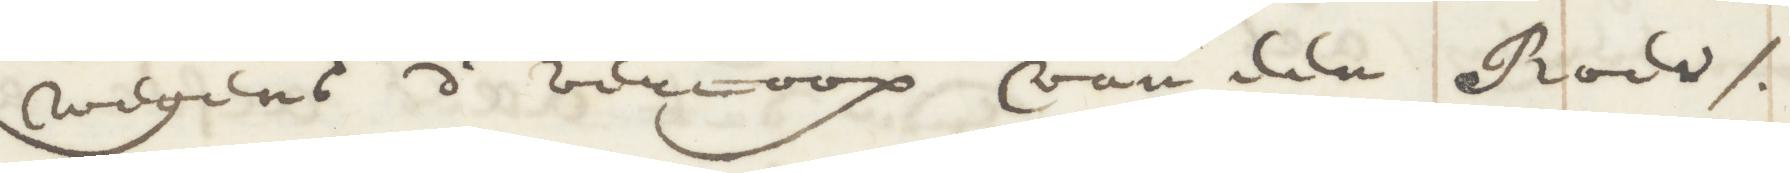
wegens d’ vercoop van een Roer/.
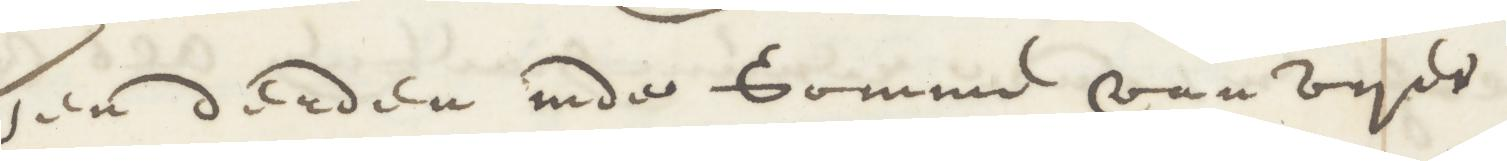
Ten derden inde Somme van vijer
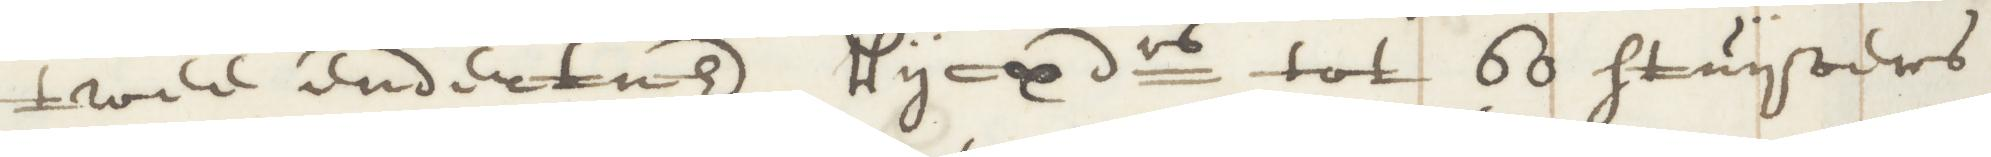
twee endertich Rijcxd=rs tot 60 stuijvers
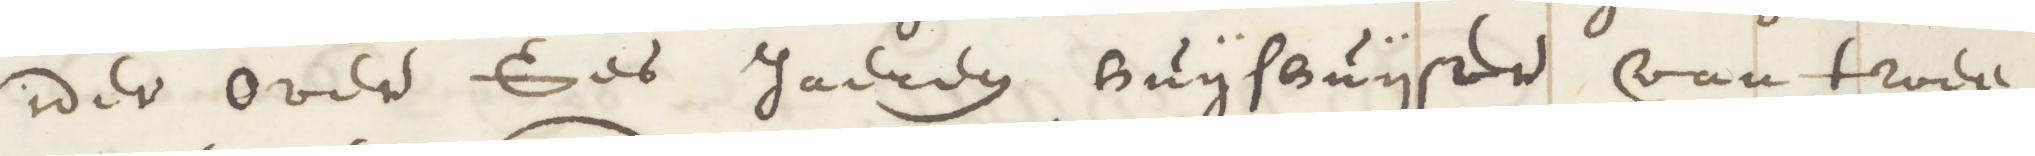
ider over Ses Jaeren huijshuijren van twee
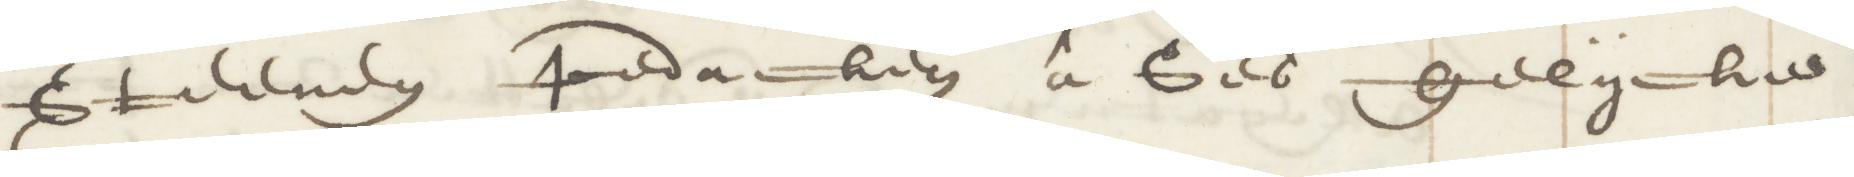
steenen pedacken â Ses gelijcke
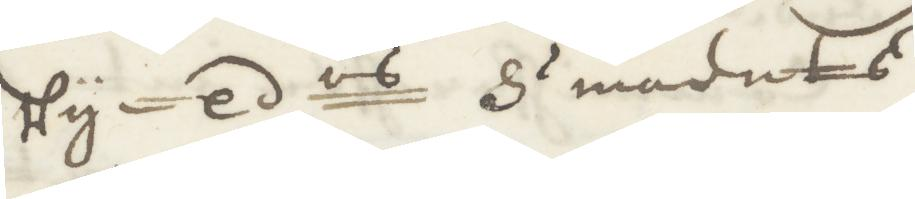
Rijcxd=rs s'maents
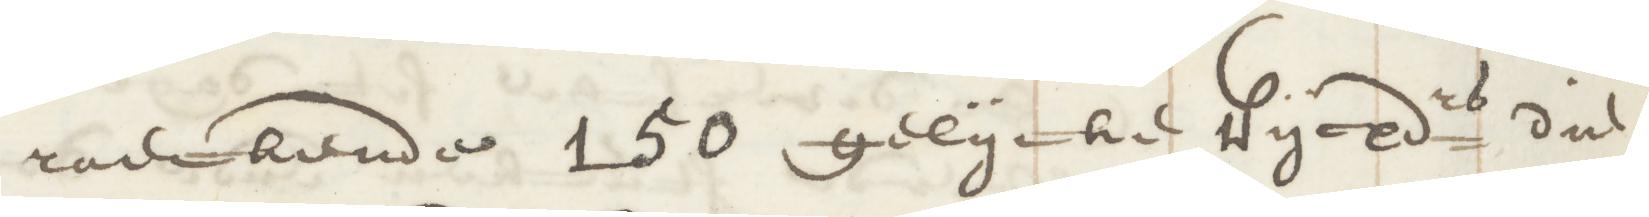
raeckende 150 gelijcke Rijcxd=rs die
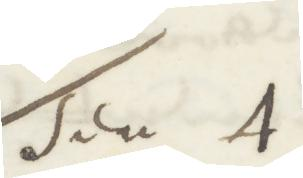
Ten 4
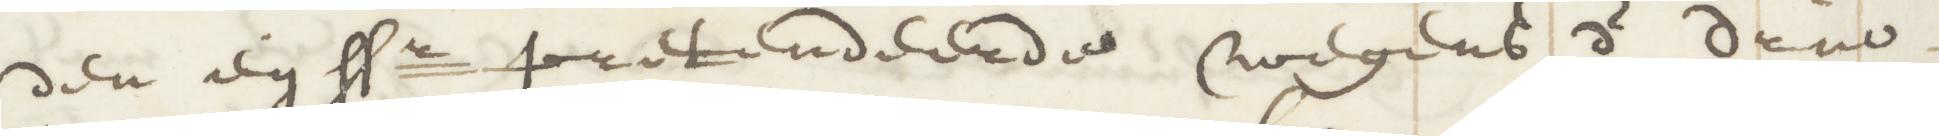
den Eijss=r pretendeerde wegens d’ drie
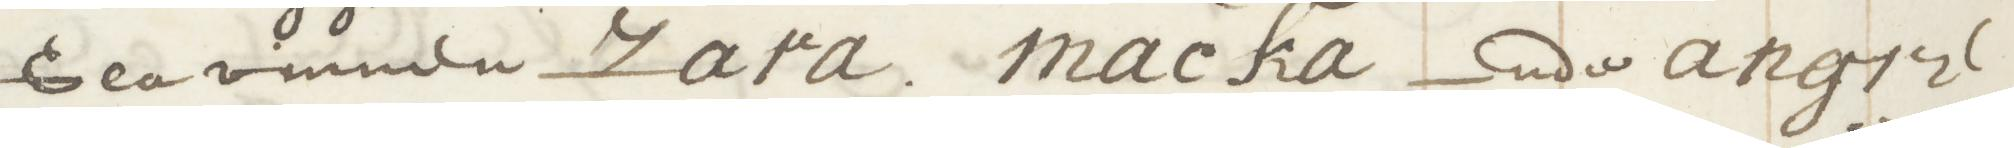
Slavinnen Zara. macka ende angie
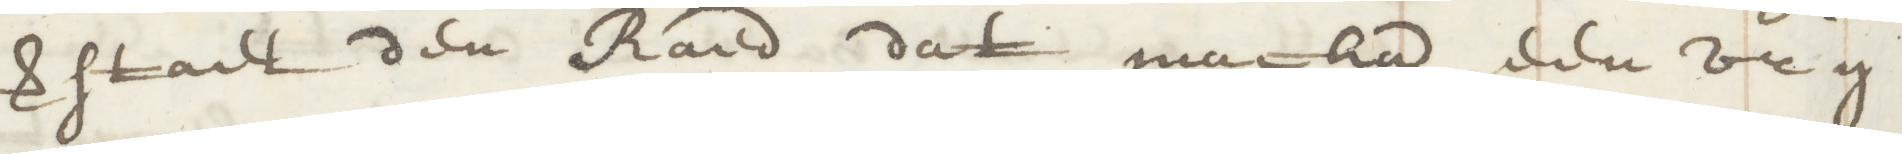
verstaet den Raed dat macka een vrij
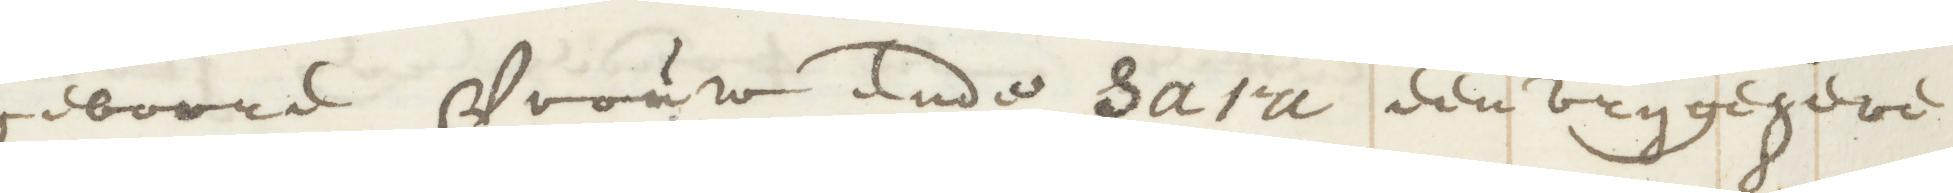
eboore Vrouw ende Sara een vrijgegeve
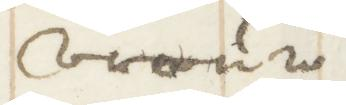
vrouw
